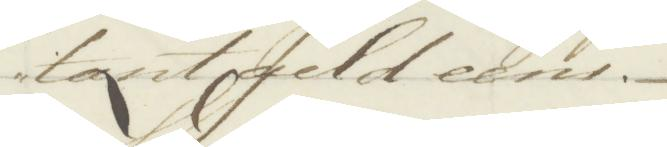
„tant geld eens.
